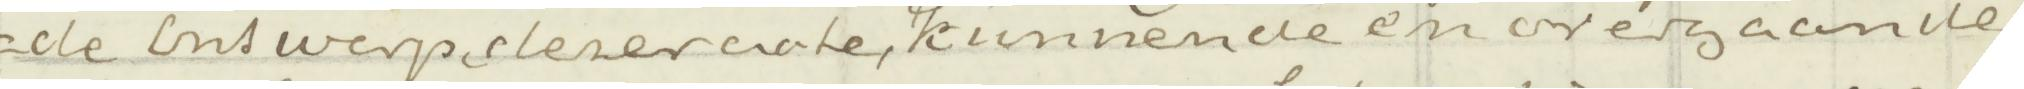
=de ontwerp, dezer acte, kunnende en overgaande
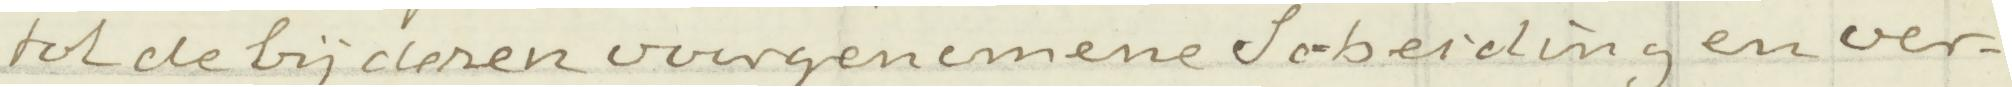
tot de bij dezen voorgenomene scheiding en ver-
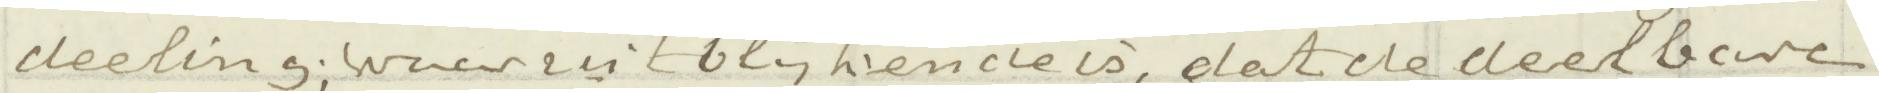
deeling; waar uit blijkende is, dat de deelbare
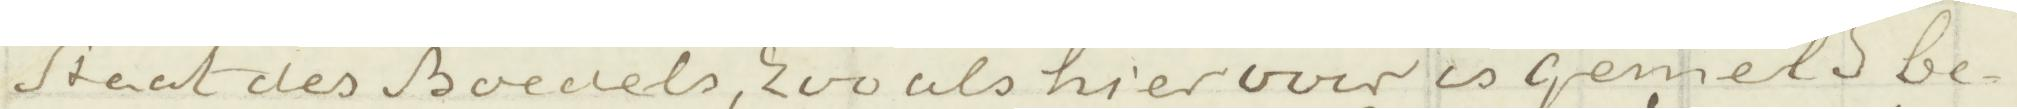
staat des Boedels, zoo als hier voor is gemeld be=
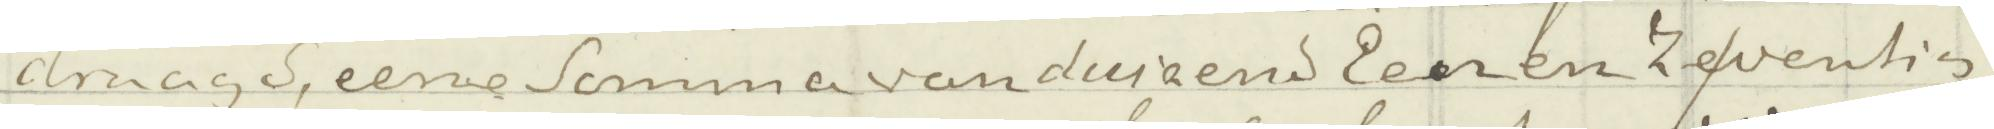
draagd, eene somma van duizend Een en zeventig
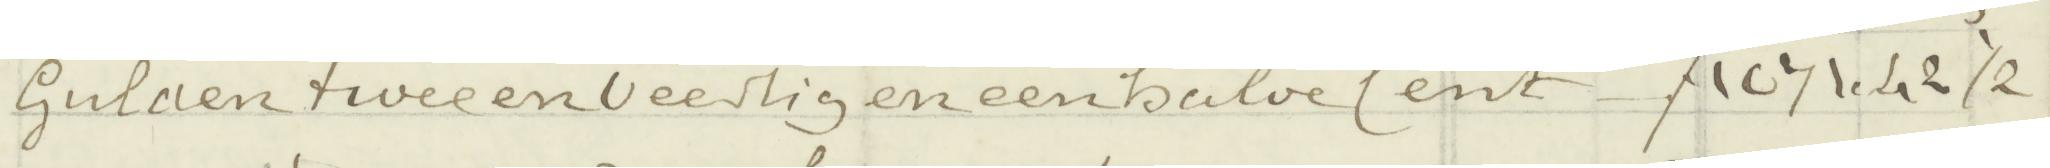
Gulden twee en veertig en een halve Cent - ƒ1071„42½
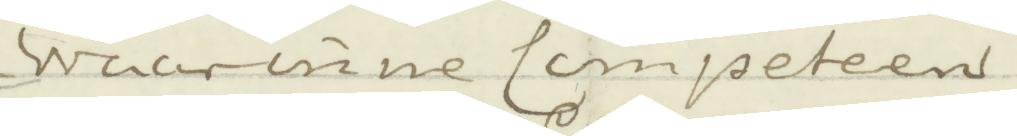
waarinne Competeerd
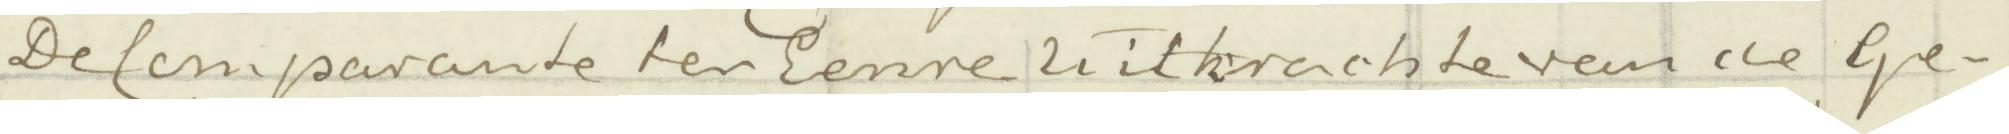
De Comparante ter Eenre uitkrachte van de Ge-
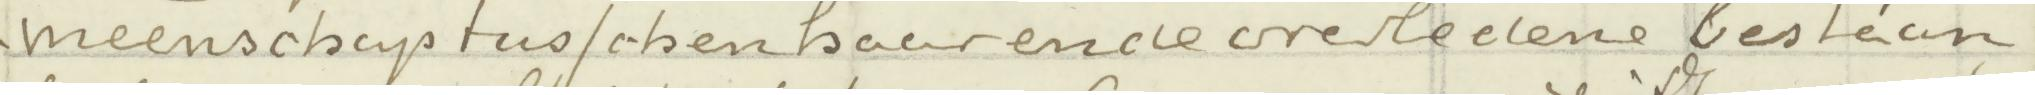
meenschap tusschen haar en de overledene bestaan
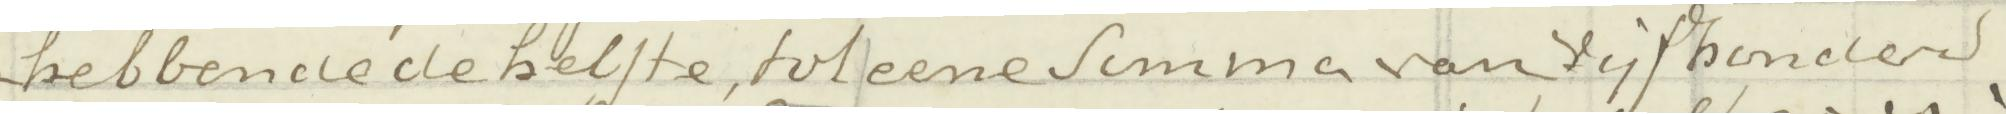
hebbende de helfte, tot eene somma van vijfhonderd
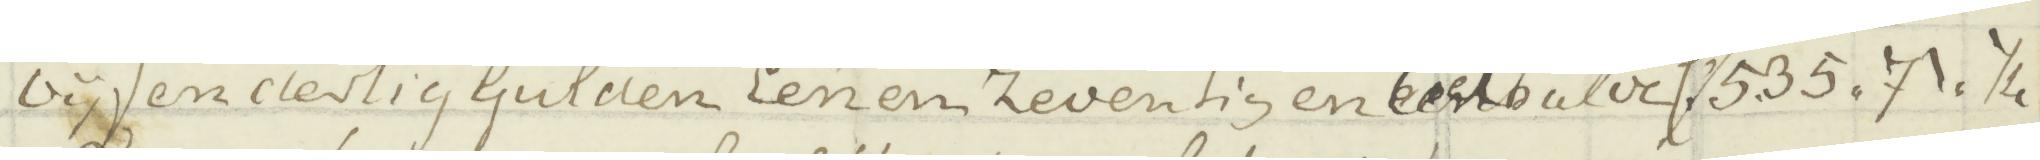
vijf en dertig Gulden Een en Zeventig en vierhalve C ƒ535„71„¼
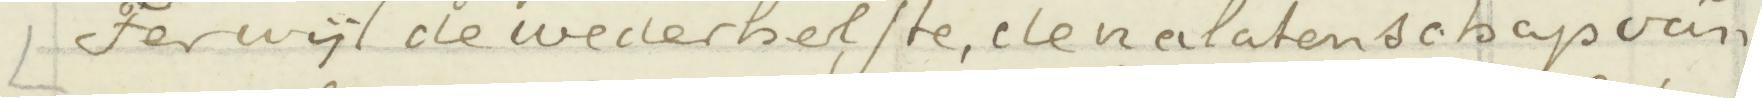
Terwijl de wederhelfte, de nalatenschap van
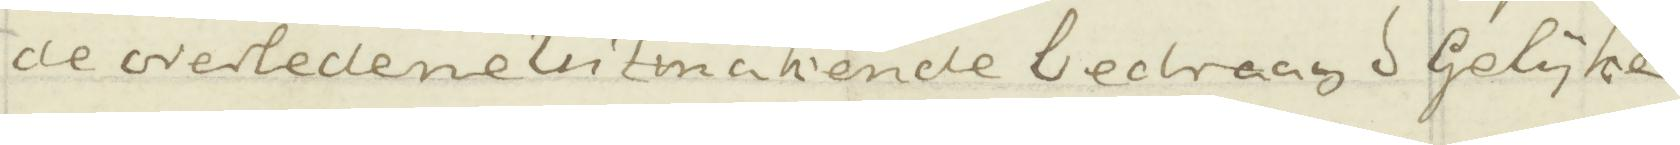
de overledene uitmakende bedraagd Gelijke
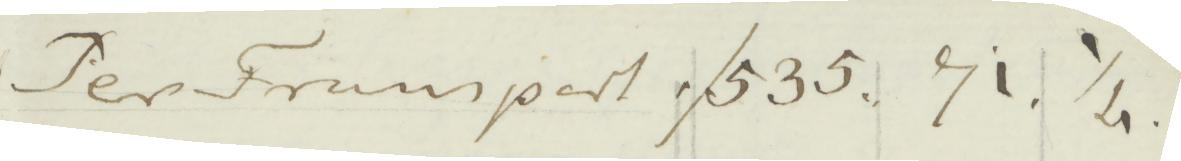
Per Transport ,ƒ535„ 71, ¼
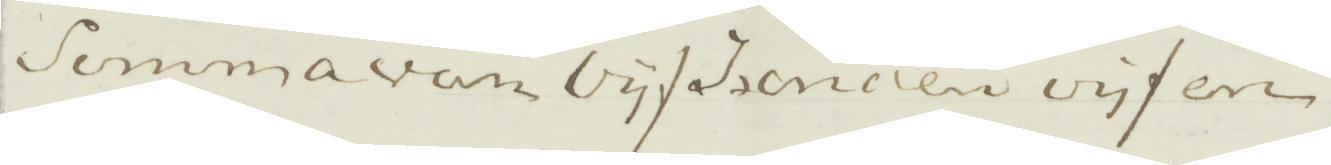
Somma van vijfhonderd vijf en
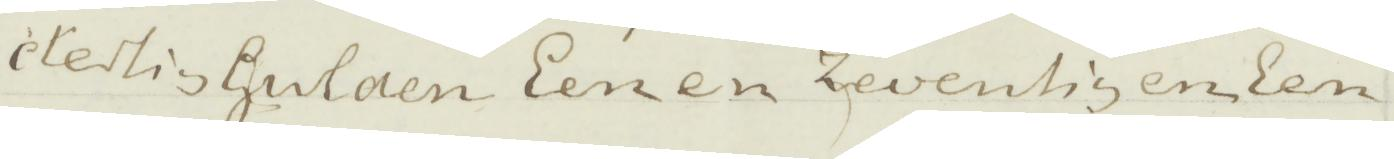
dertig Gulden Een en Zeventig en Een
